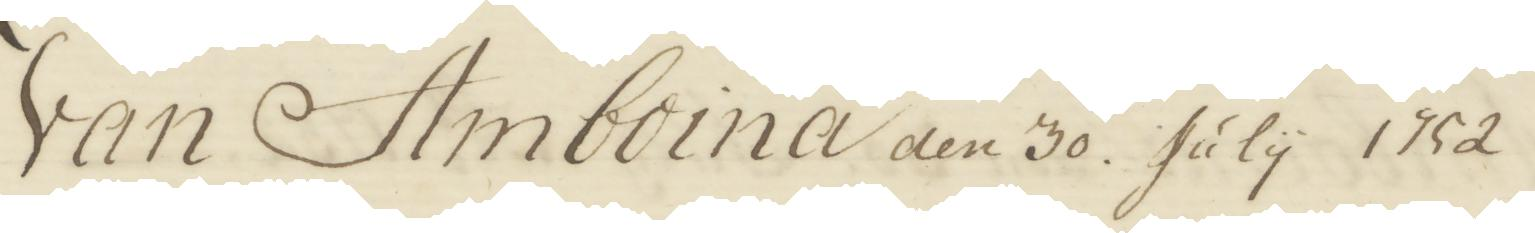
Van Amboina den 30. Julij 1752.
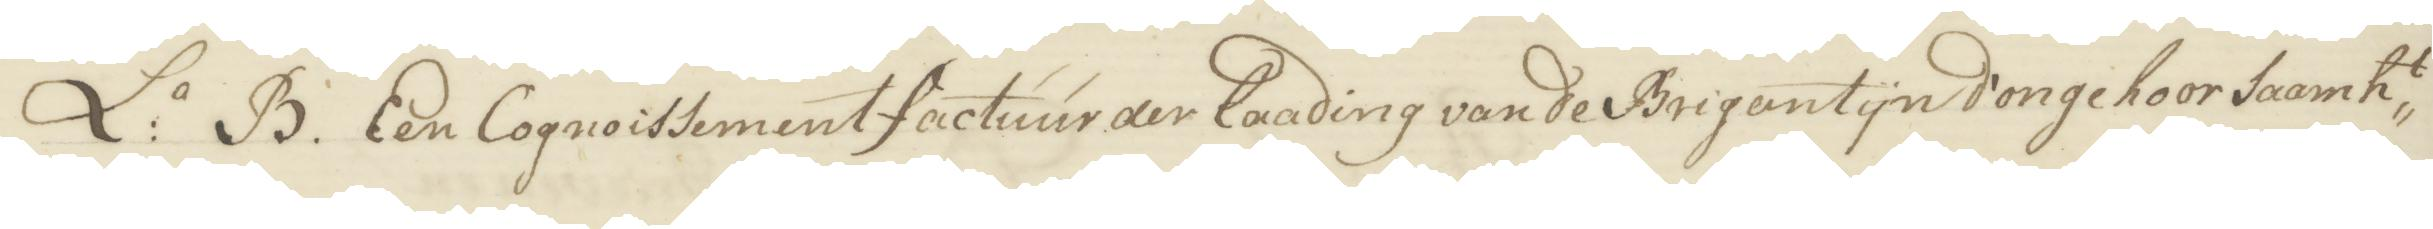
L:a B. Een Cognoissement factuur der laading van de Brigantijn d'ongehoorsaamh„t
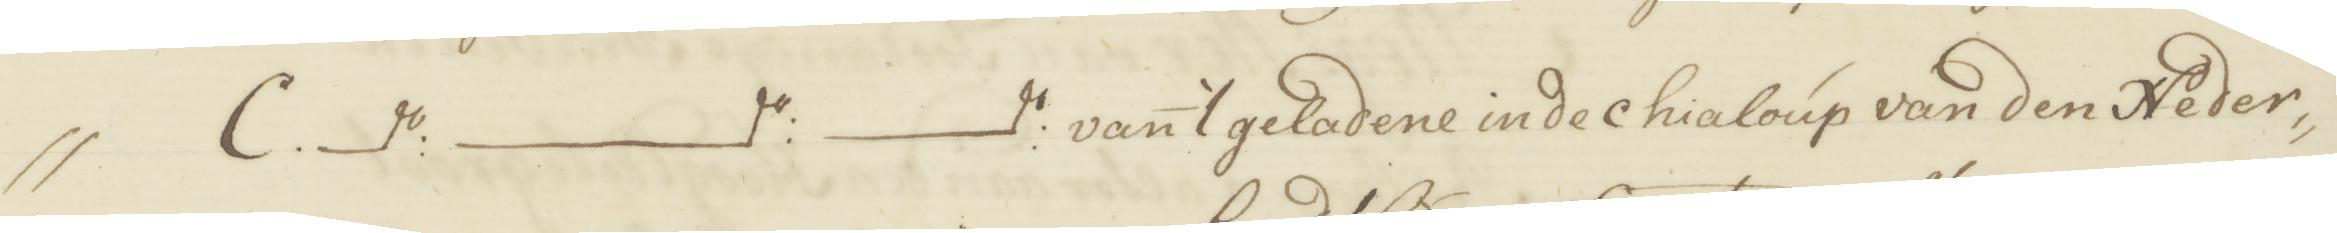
„ C. —:o —:o —:o van ’t geladene in de chialoup van den Neder„
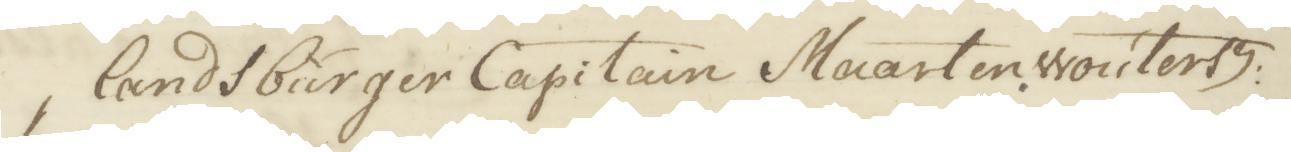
landsburger Capitain Maarten woutersz:
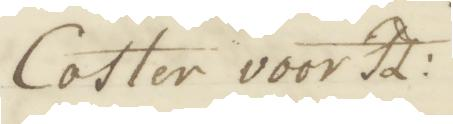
Coster voorsz:
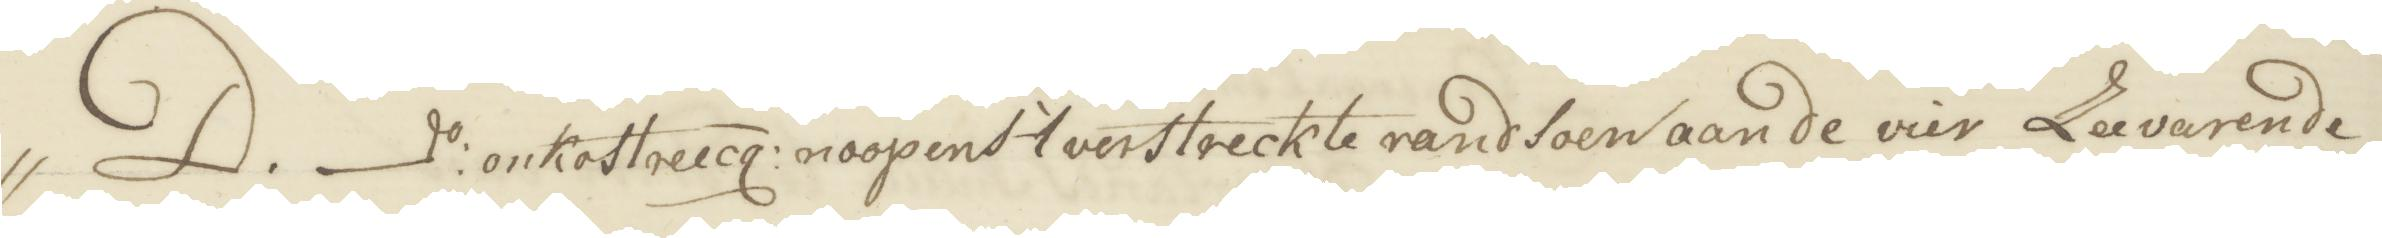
„ D. —:o onkostreecq: noopens ’t verstreck te randsoen aan de vier Zeevarende
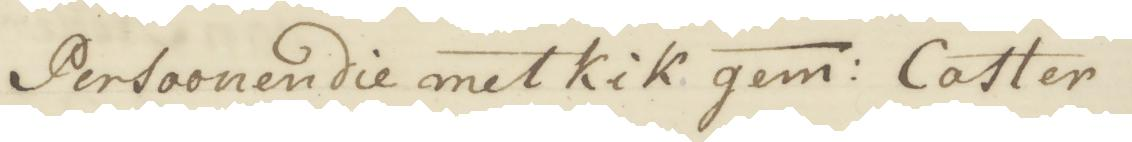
Persoonen die met K i K gem: Coster
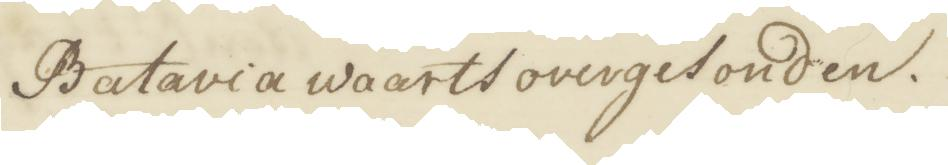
Batavia waarts overgesonden.
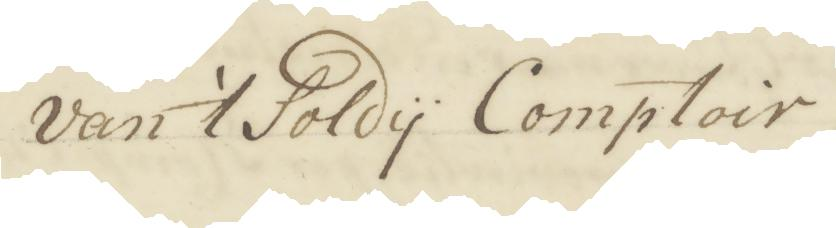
van ’t Soldij Comptoir
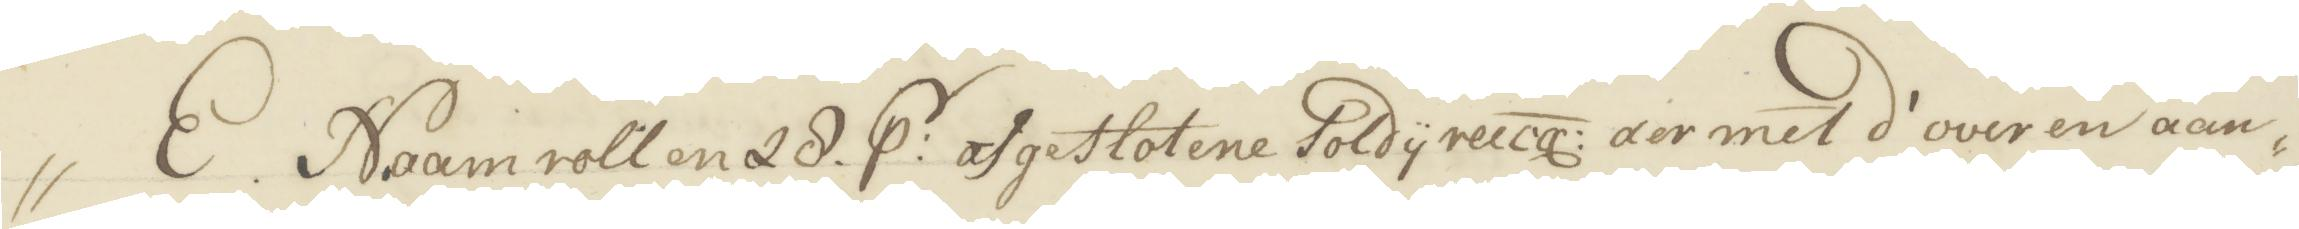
„ E. Naamroll en 28. p:s afgeslotene Soldij reecq: der met d’ over en aan„
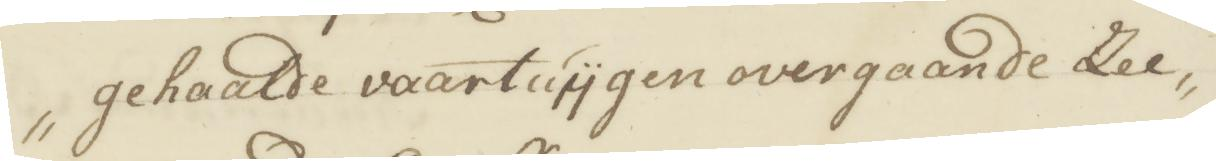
„gehaalde vaartuijgen overgaande Zee„
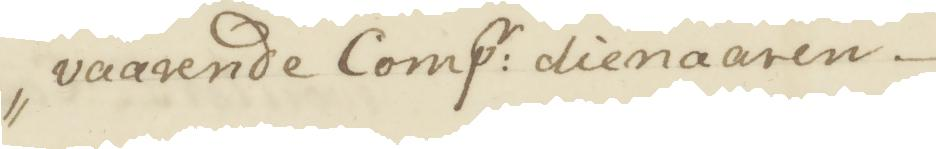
„vaarende Comp:s dienaaren .
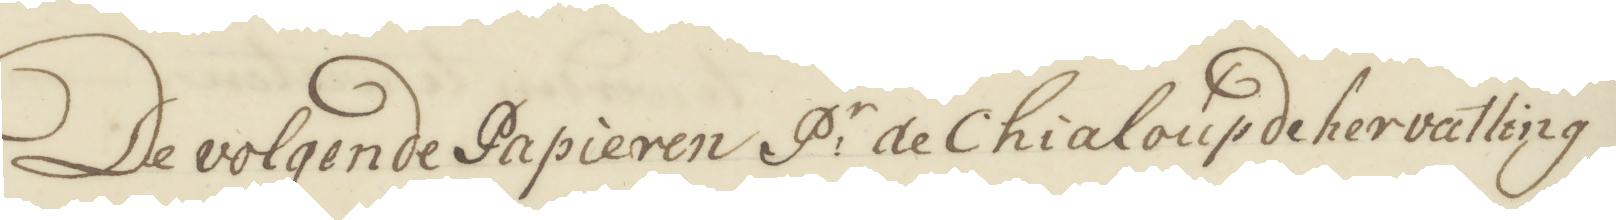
De volgende Papieren P:r de Chialoup de hervatting
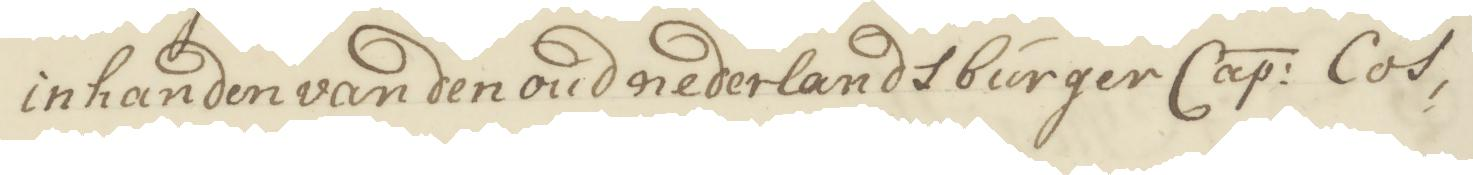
in handen van den oud nederlands burger Cap: Cos„
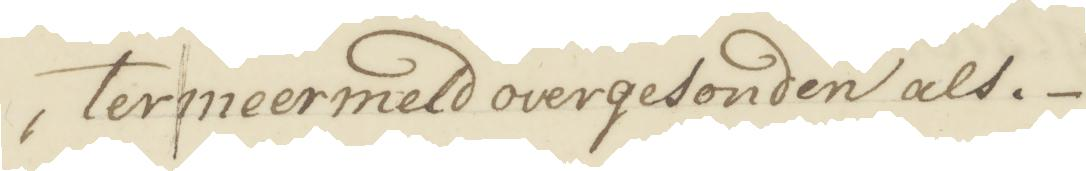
„ter meermeld overgesonden als. —
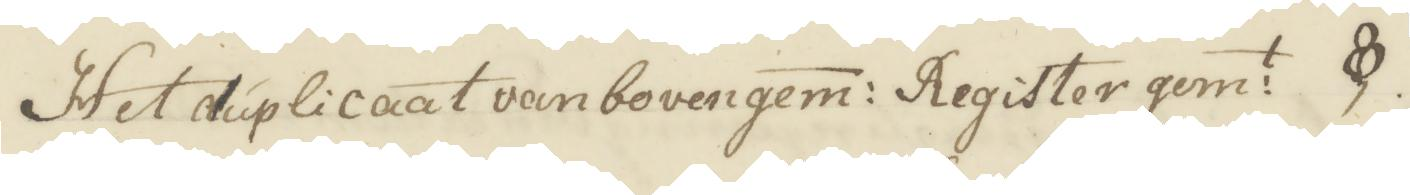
Het duplicaat van boven gem: Register gem:t .§
